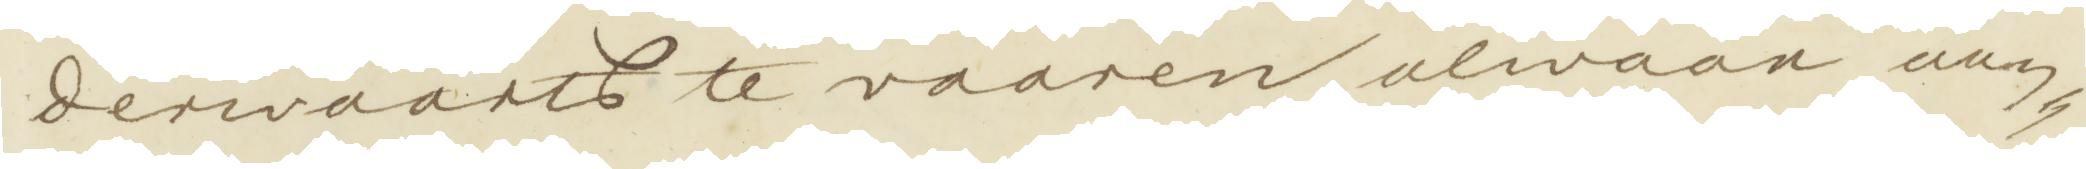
derwaarts te vaaren alwaar aan„
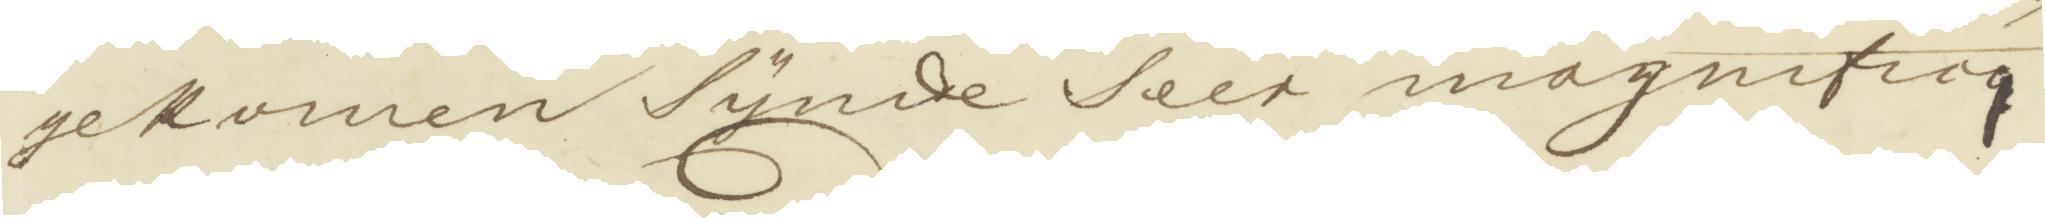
gekomen sijnde seer magnificq
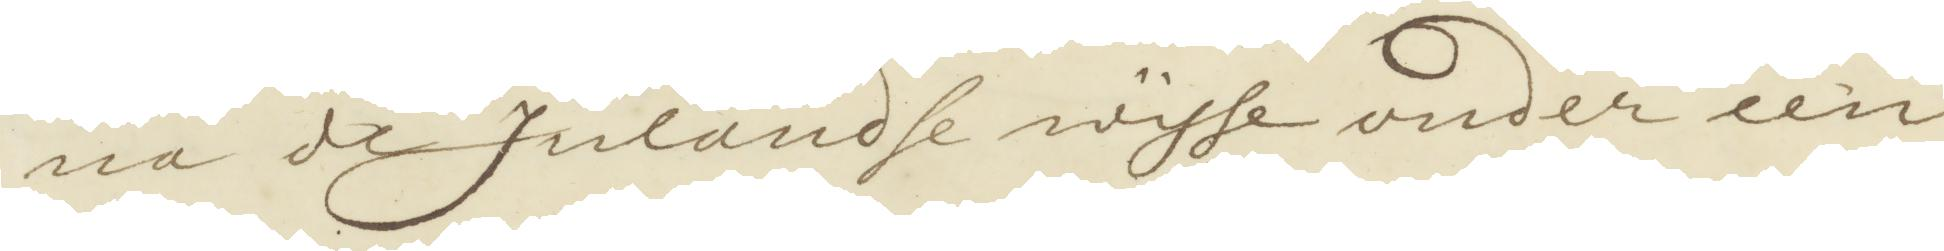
na de Jnlandse wijse onder een
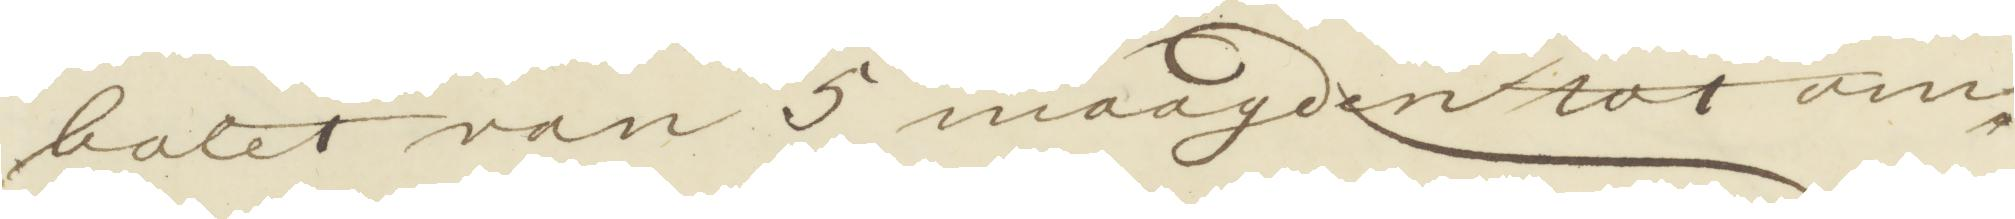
balet van 5 maagden tot om„
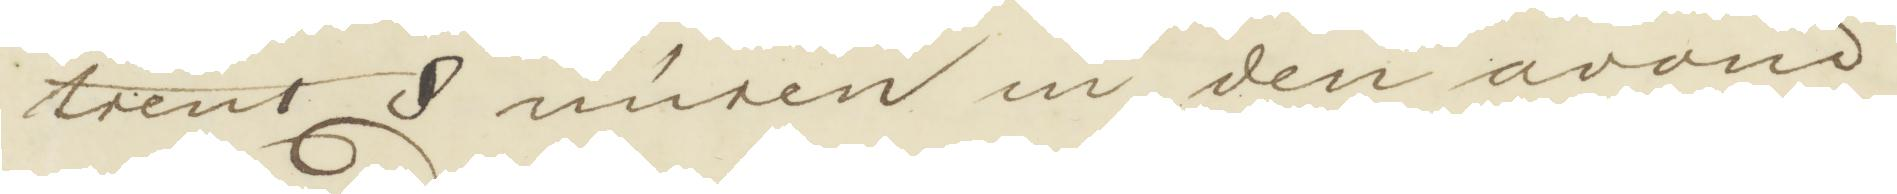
trent 8 uuren in den avond
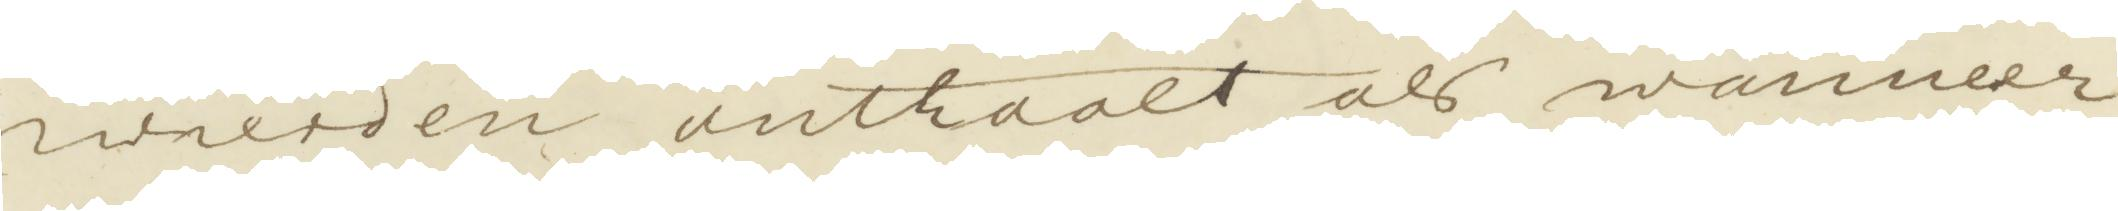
wierden onthaalt als wanneer
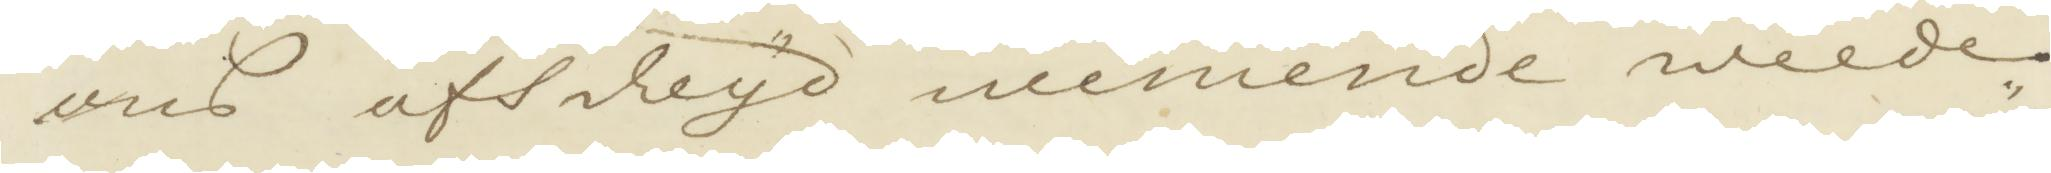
ons afscheijd neemende weede„
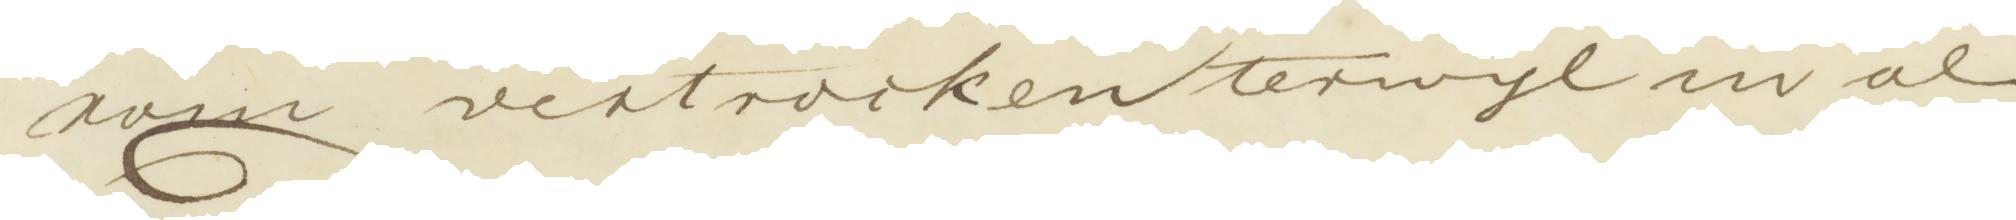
rom vertrocken terwijl in al
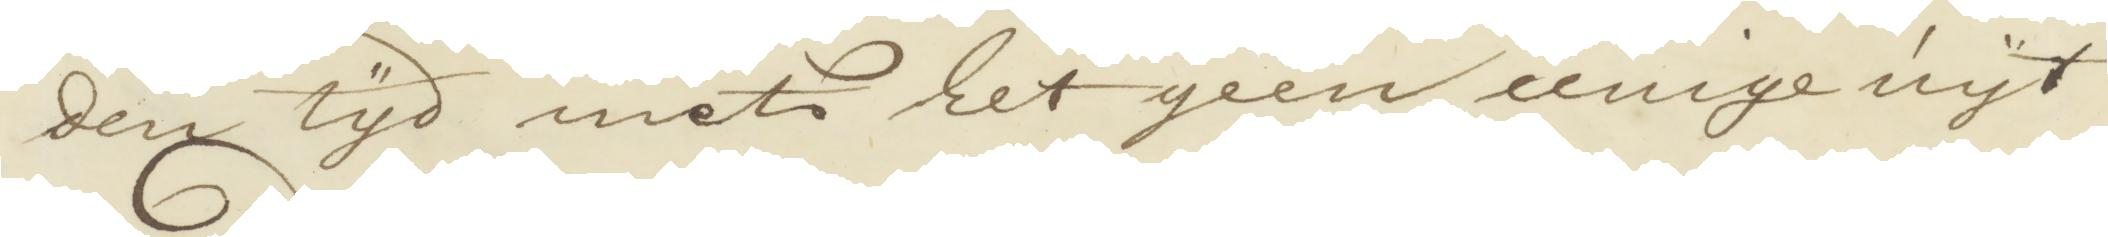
den tijd niets het geen eenige uijt
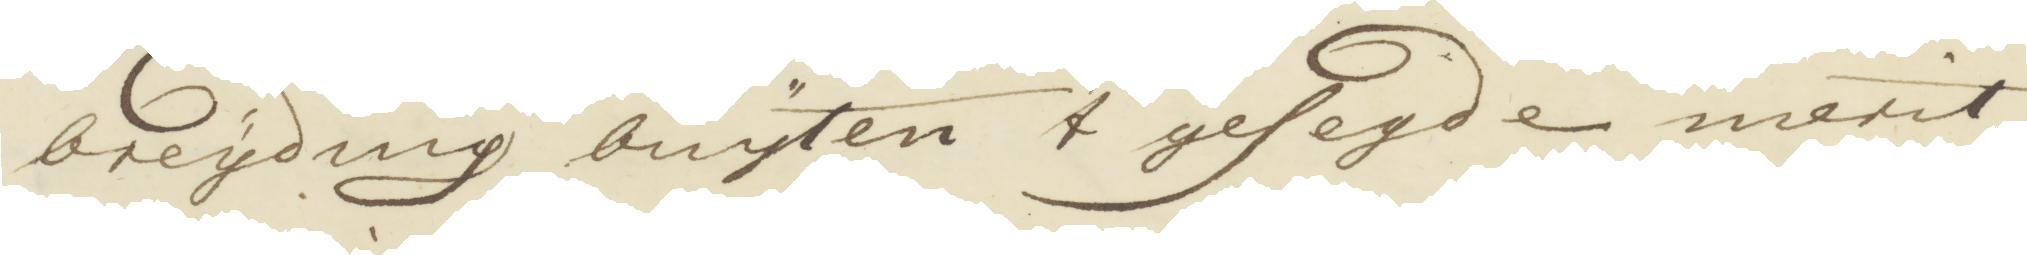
breijding buijten ’t geseijde merit
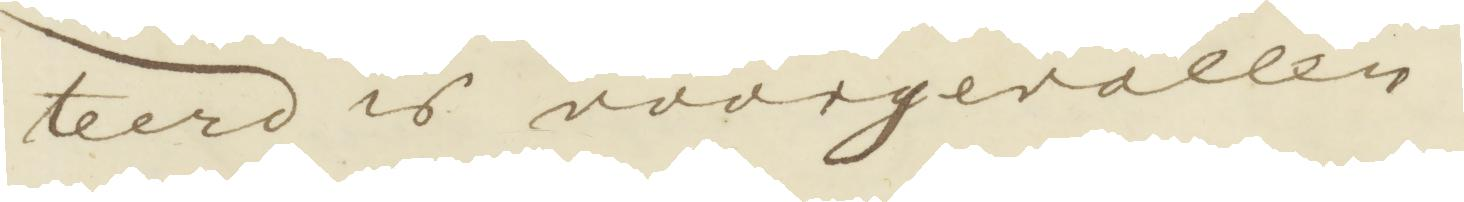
teerd is voorgevallen
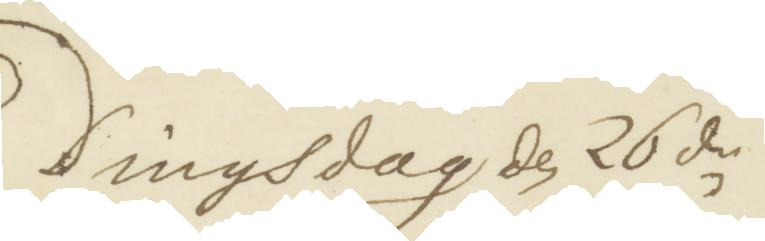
Dingsdag den 26„en
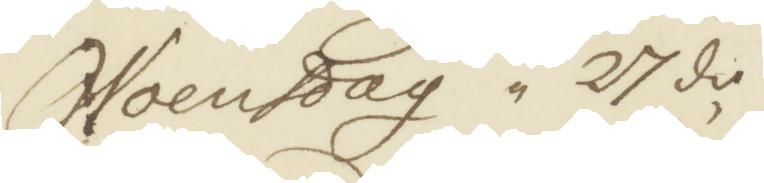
Woensdag „ 27„en
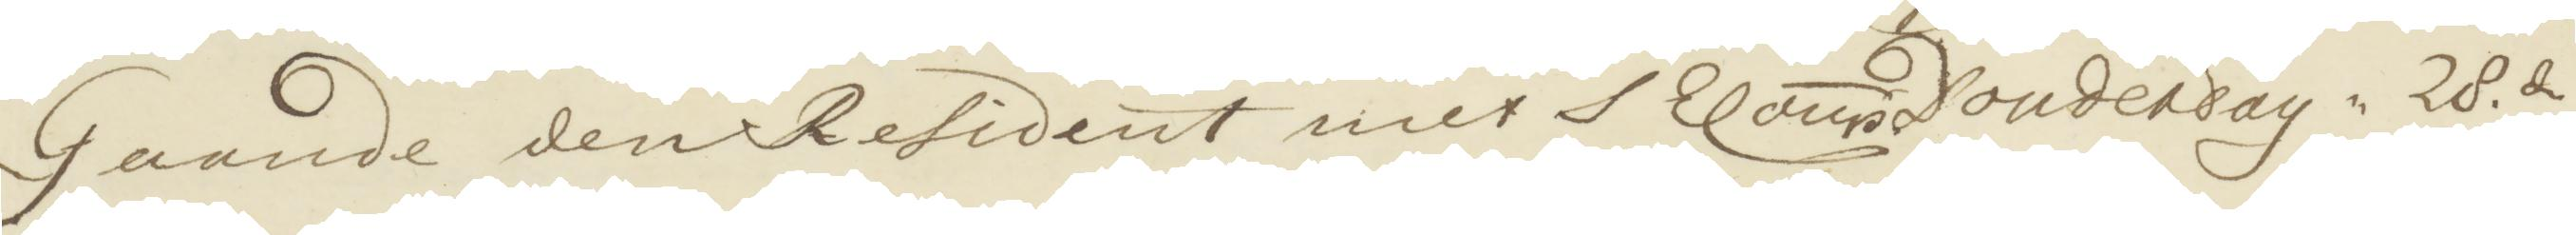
Gaande den Resident met s EComp Donderdag „ 28.en
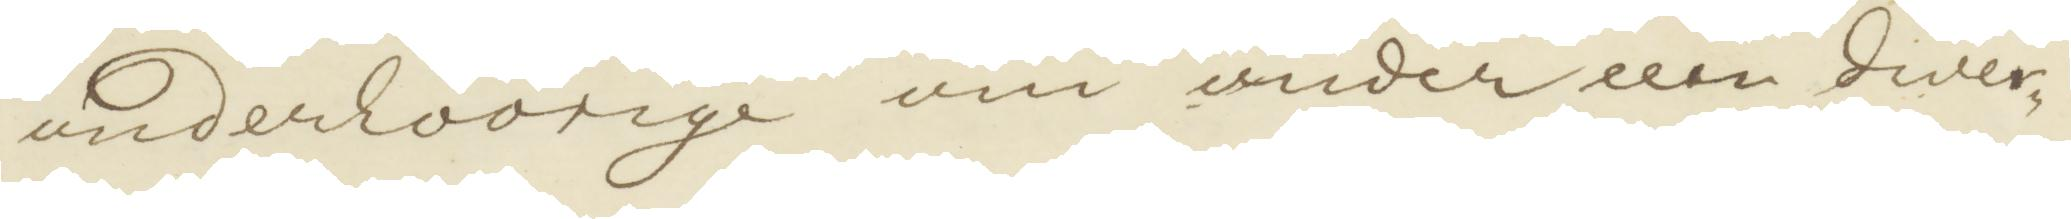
onderhoorige om onder een diver„
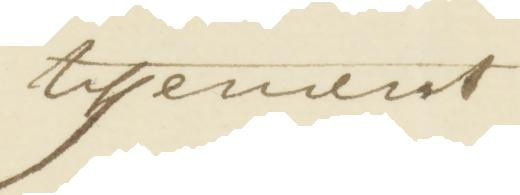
tissement
